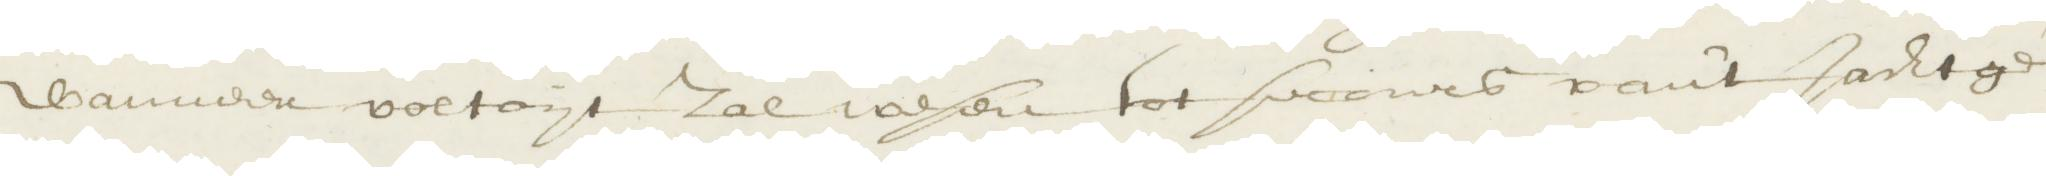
wanneer voltoijt Zal wesen tot secours van ’t Jachtge
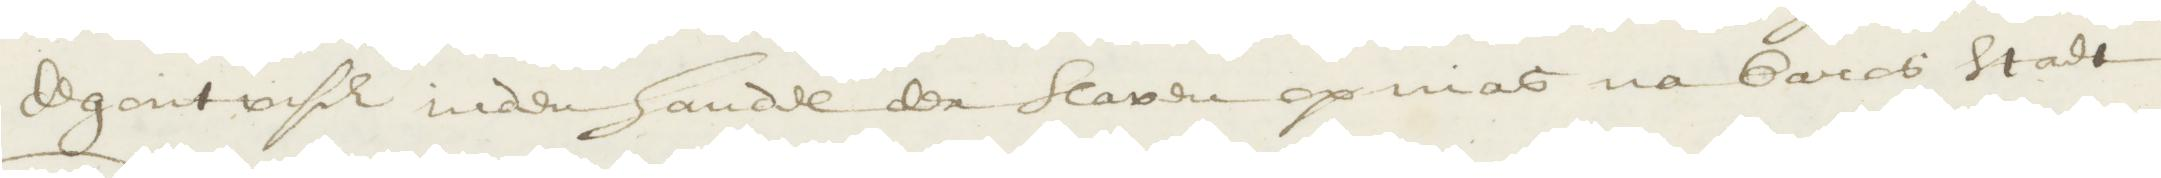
degoutvisch inden handel der slaven op nias na baros staet
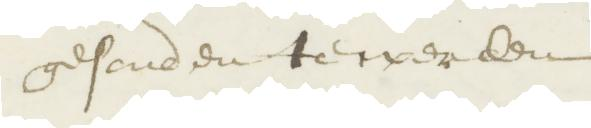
gesonden tewerden.
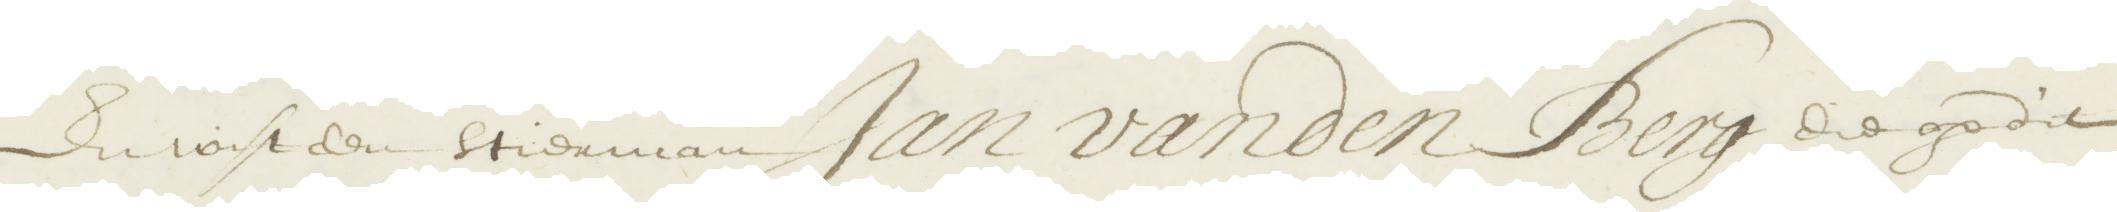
En wist den stierman Jan vanden Berg die op dit
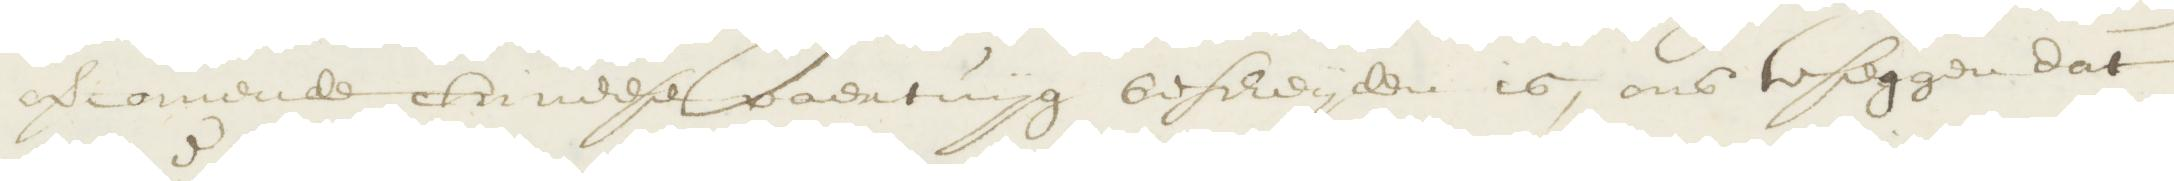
overcomende chineese vaertuijg bescheijden is, ons teseggen dat
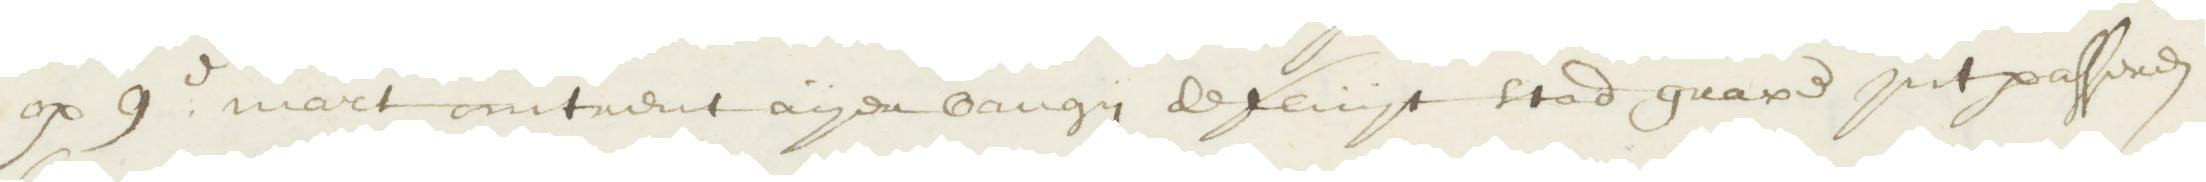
op 9:e mart omtrent aijer bangij de fluijt stad grave jnt passeren
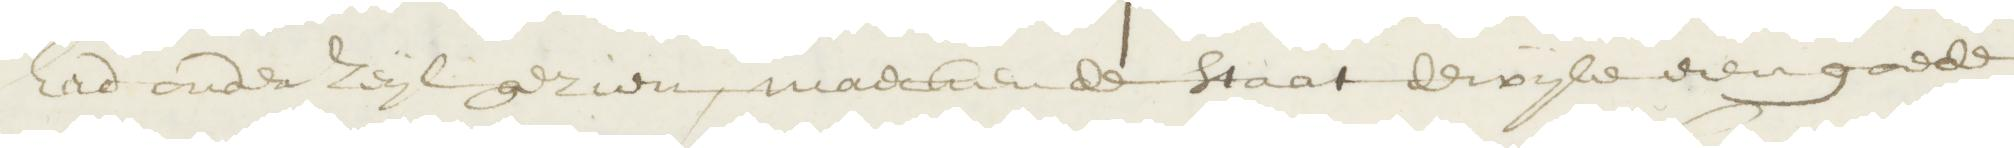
had onder Zeijl gezien, maeckende staat dewijle den goede
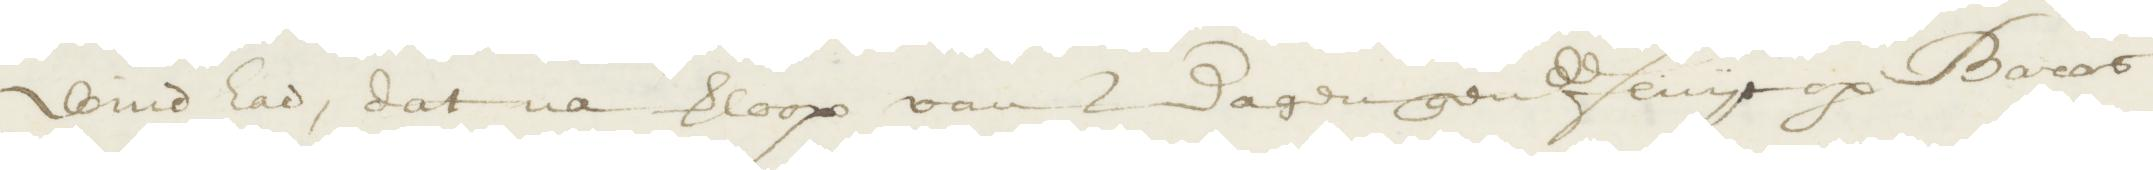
wind had, dat na verloop van 2 Dagen gem-de fluijt op Baros
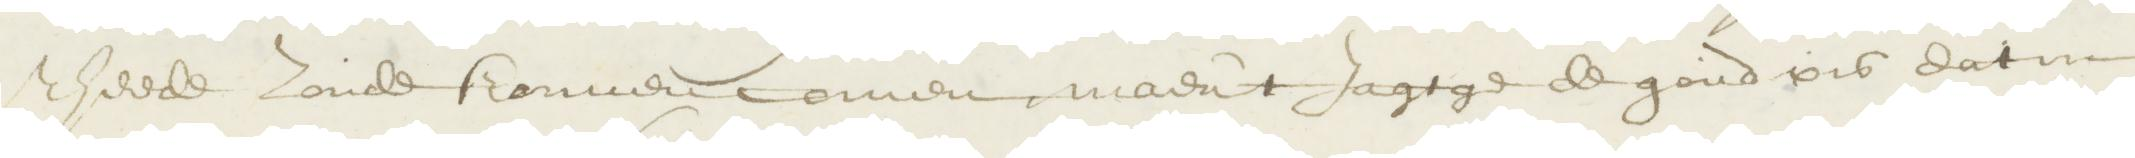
rheede Zoude konnen comen maer ’t jagtge de goud vis dat in
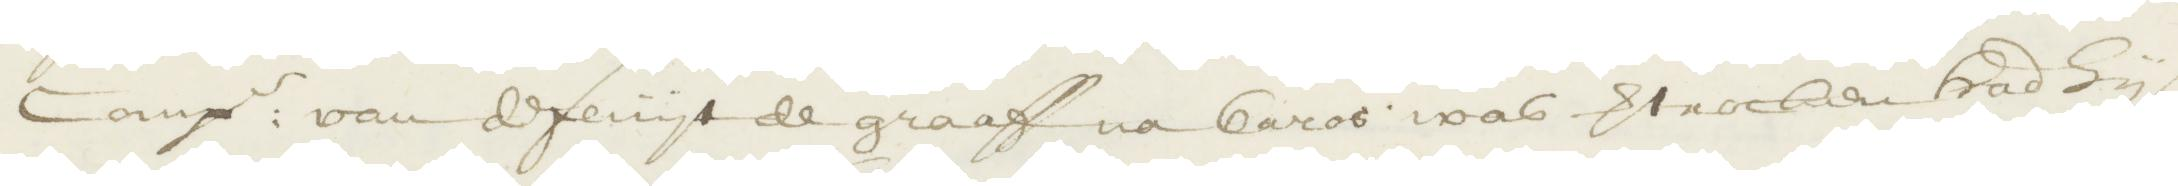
Comp:e van de fluijt de graaff na Baros was vertrocken had hij
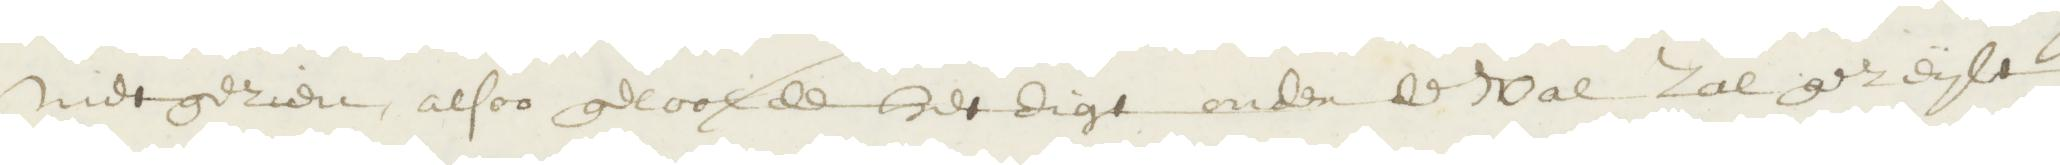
niet gezien, alsoo geloofde het digt onder de wal Zal gezeijlt
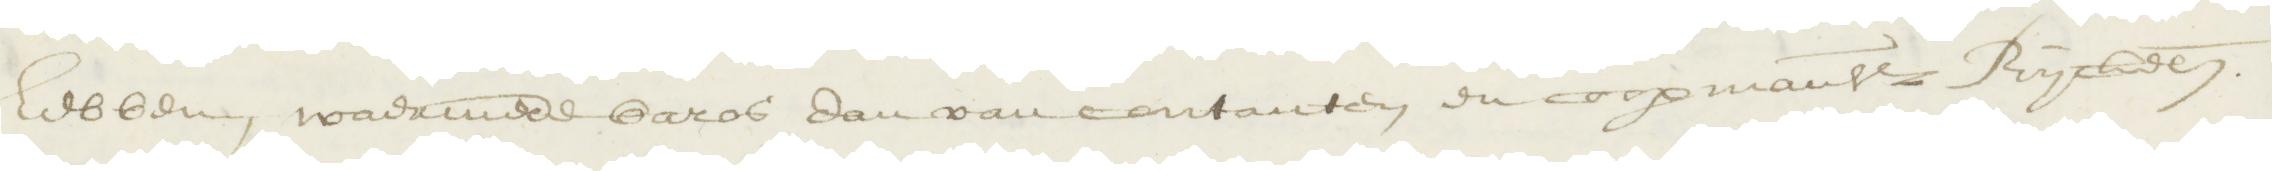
hebben, waermede baros dan van contanten en coopmansz Rijckelijk
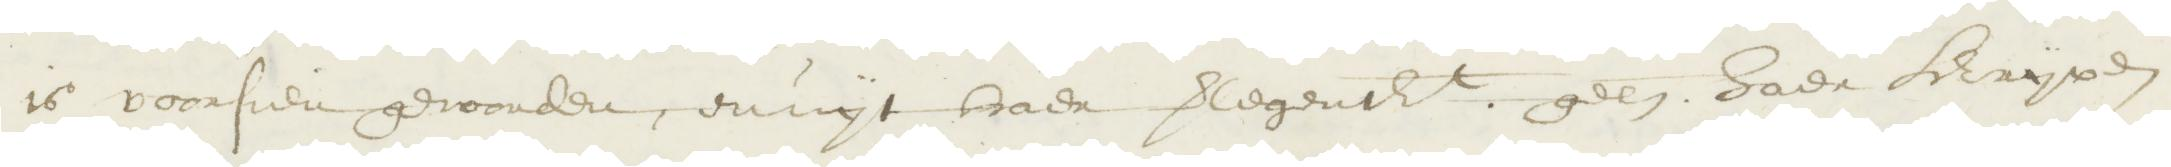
is voorsien geworden, en uijt haer verlegenth.t gelijk haer schrijven
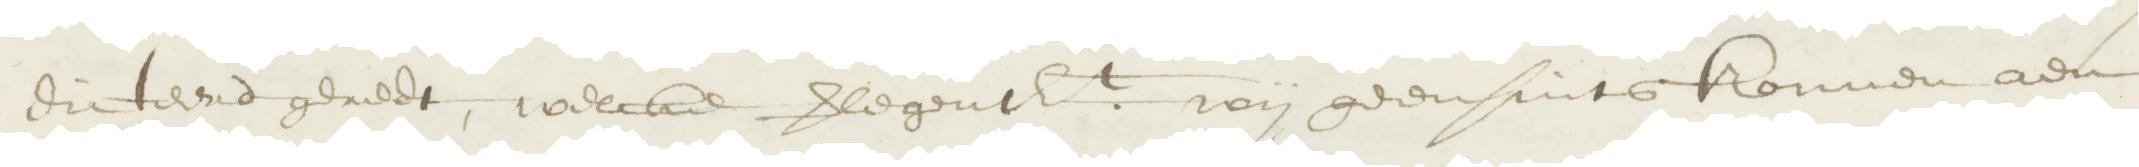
dicteerd geredt, welcke verlegenth.t wij geensints Konnen aen
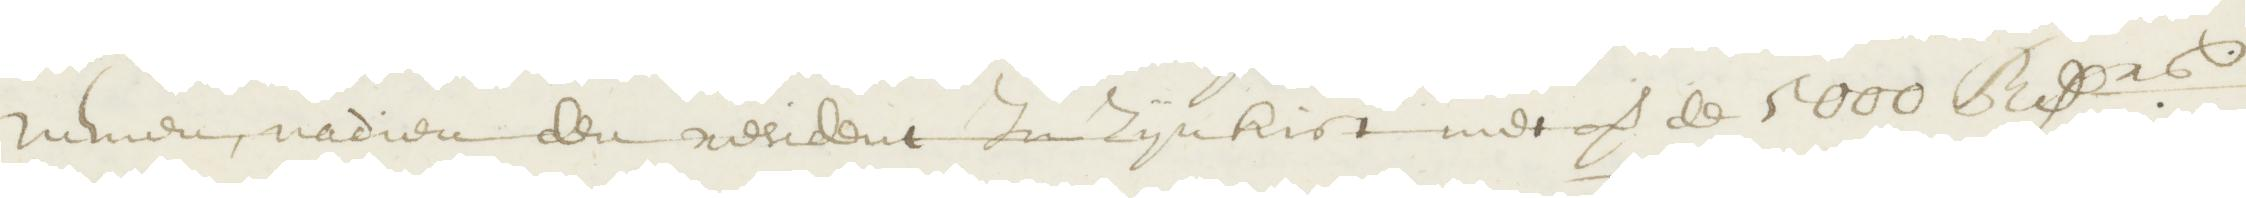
nemen, nadien den resident In Zijn kist met over de 5000 Rxrs
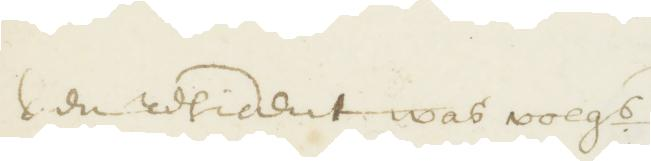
d: en resident was volgs
